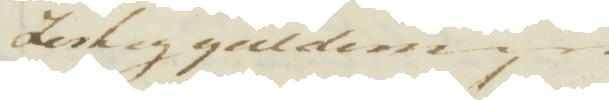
Zestig gulden
